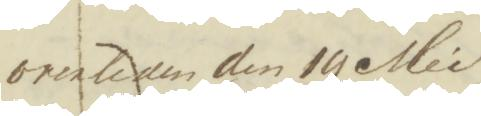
overleden den 19 Mei
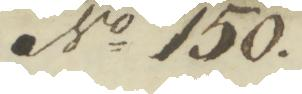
N=o 150.
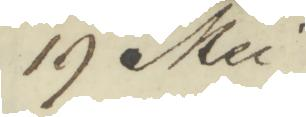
19 Mei
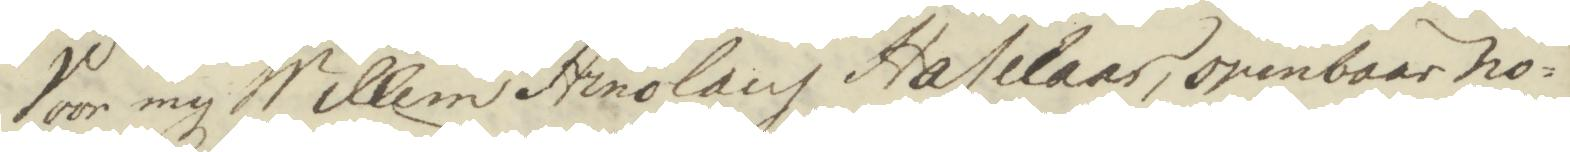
Voor my Willem Arnoldus Haselaar, openbaar no=
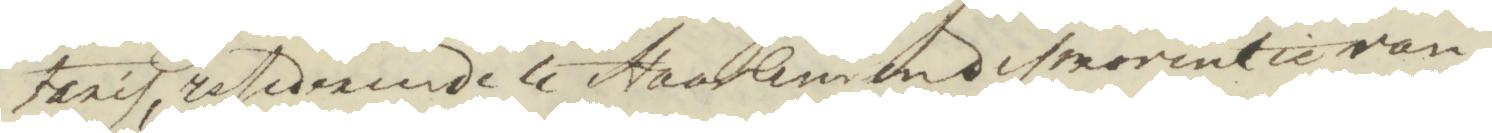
=taris, residerende te Haarlem in de provintie van
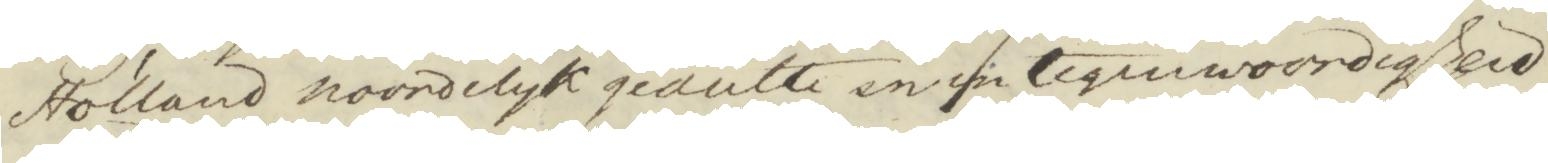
Holland noordelyk gedeelte en in tegenwoordigheid
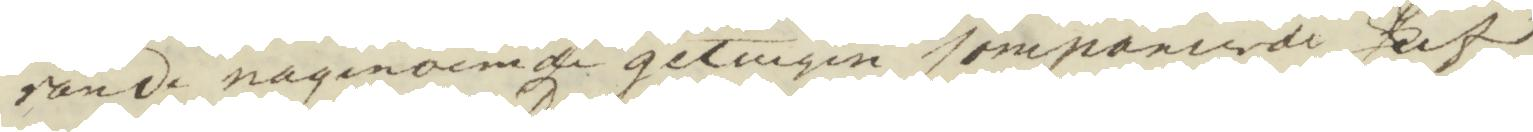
van de nagenoemde getuigen Compareerde juf
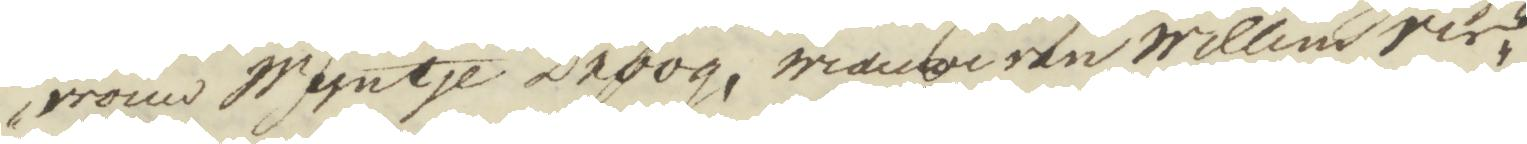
„vrouw Wyntje Droog, weduwe van Willem Ver„
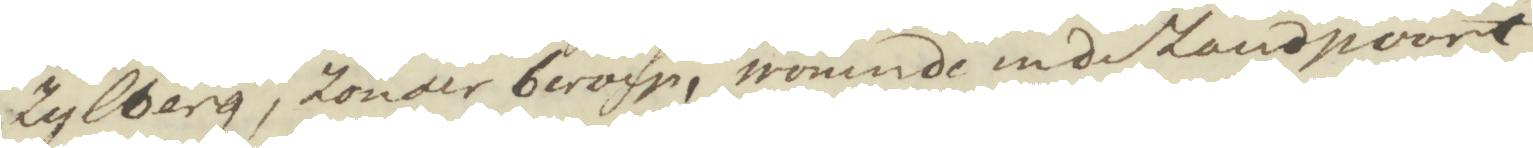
zylberg, zonder beroep, wonende in de zandpoort
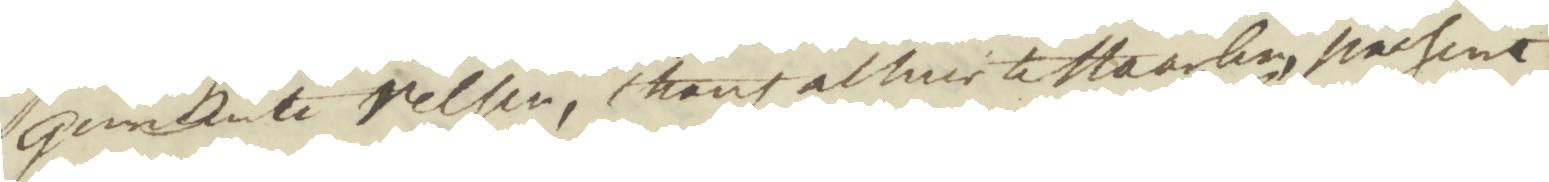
Gemeente Velsen, thans alhier te Haarlem present
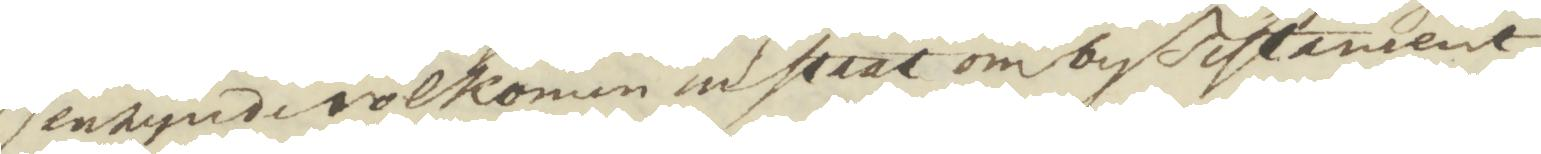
en zynde volkomen in staat om by Testament
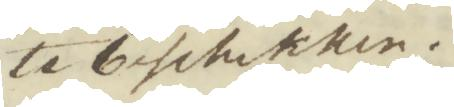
te beschikken.
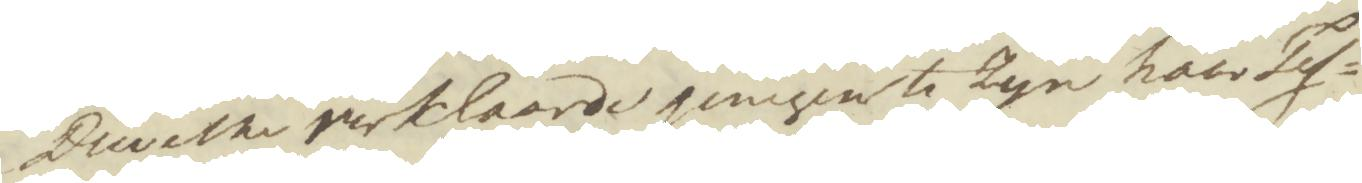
Dewelke verklaarde genegen te zyn haar Tes=
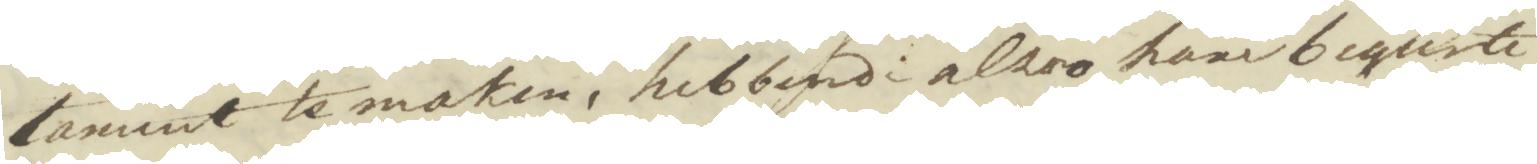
tament te maken, hebbende alzoo hare begeerte
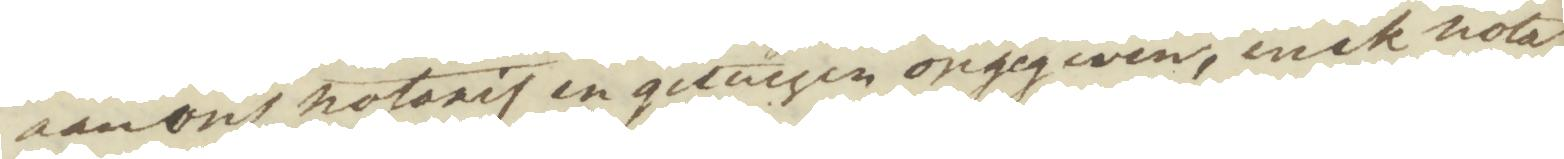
aan ons notaris en getuigen opgegeven, en ik nota
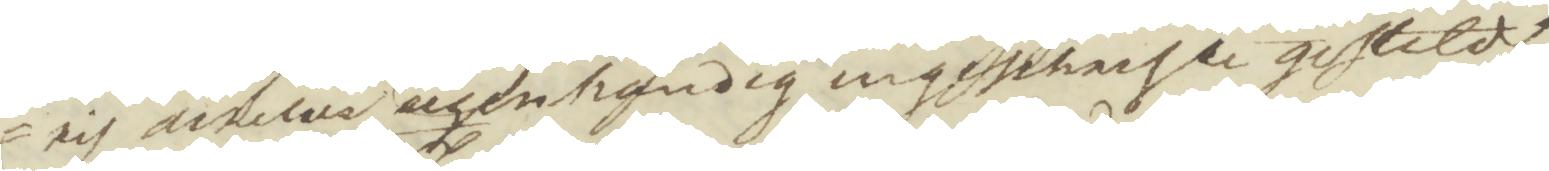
=ris dezelve eigenhandig in geschrifte gesteld,
